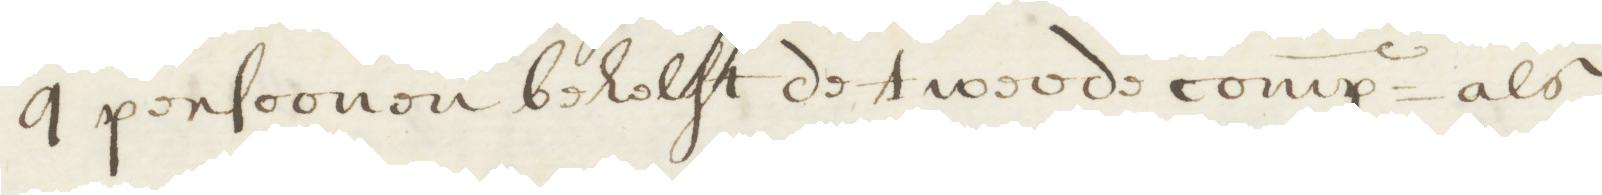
4 persoonen behelst de tweede comp=e als
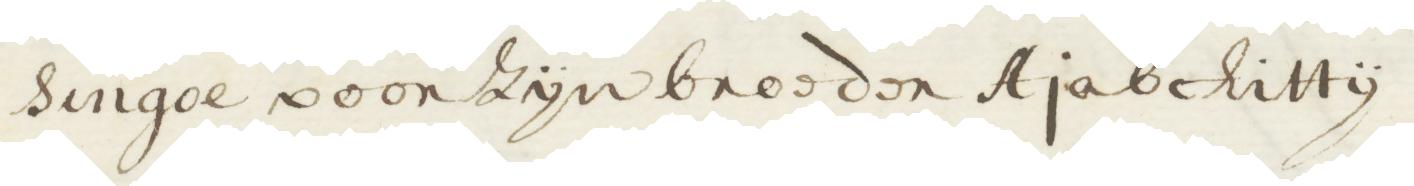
singoe voor zijn broeder Ajabchittij
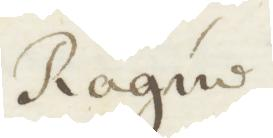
Rogue
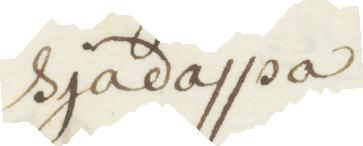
sjadappa
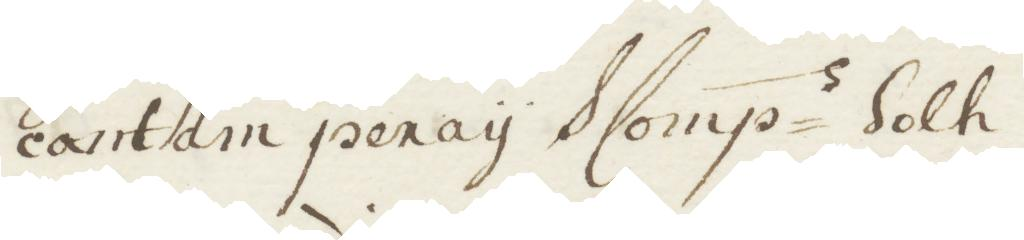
cantam peraij S Comp=s tolk
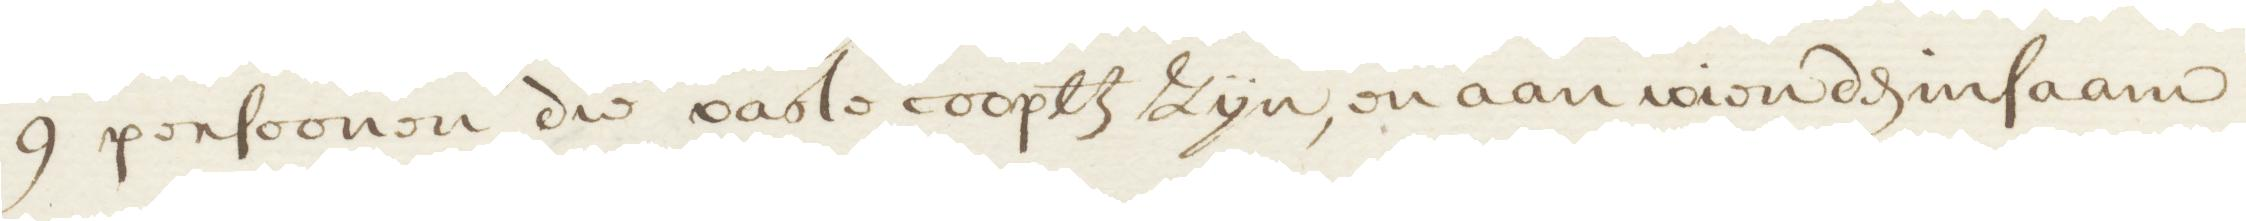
9 persoonen die vaste coopl zijn, en aan wien den insaam
